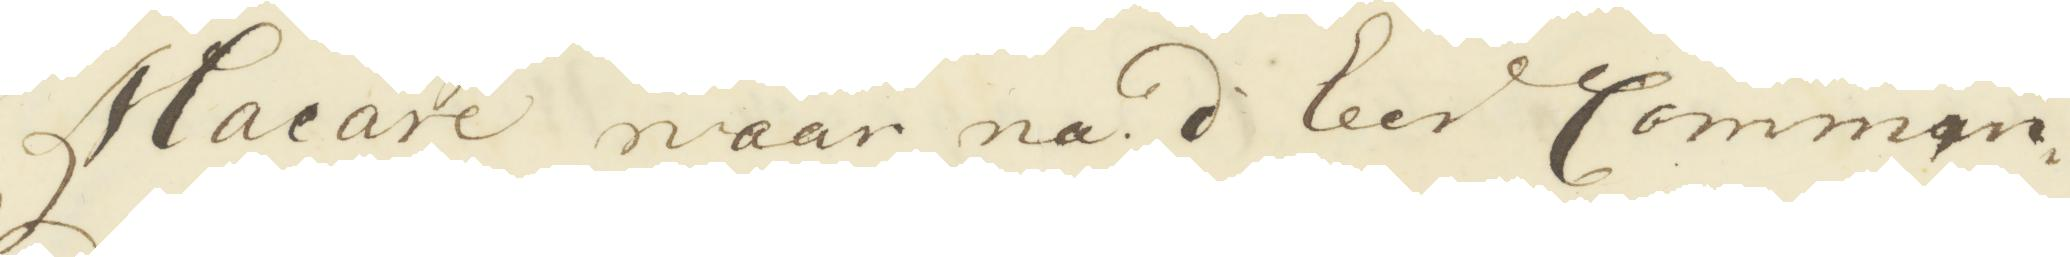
Macaré waar na. d’ heer Comman„
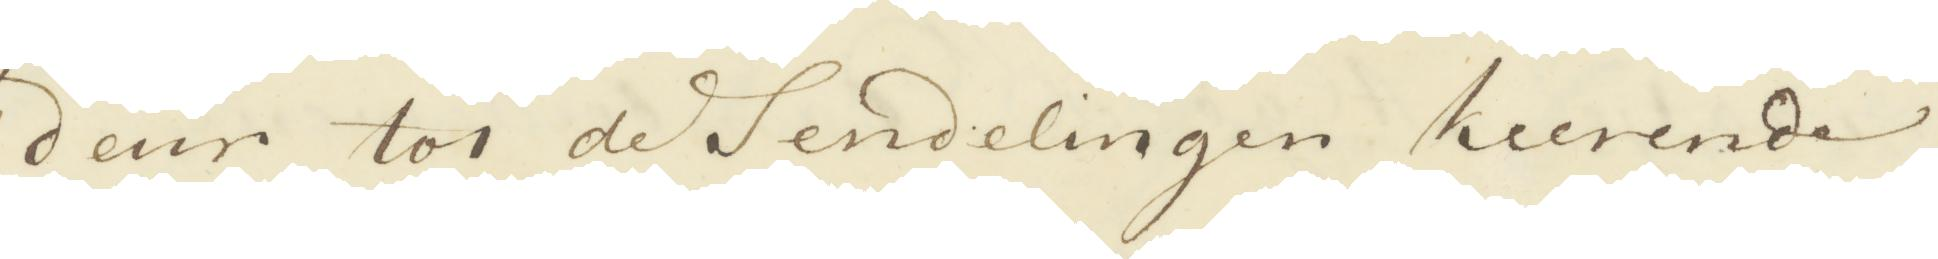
deur tot de sendelingen keerende
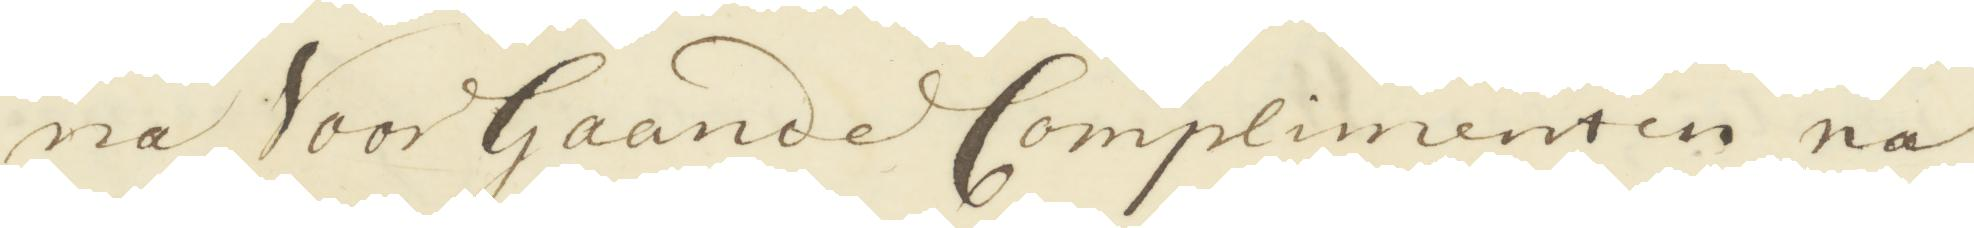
na Voor Gaande Complimenten na
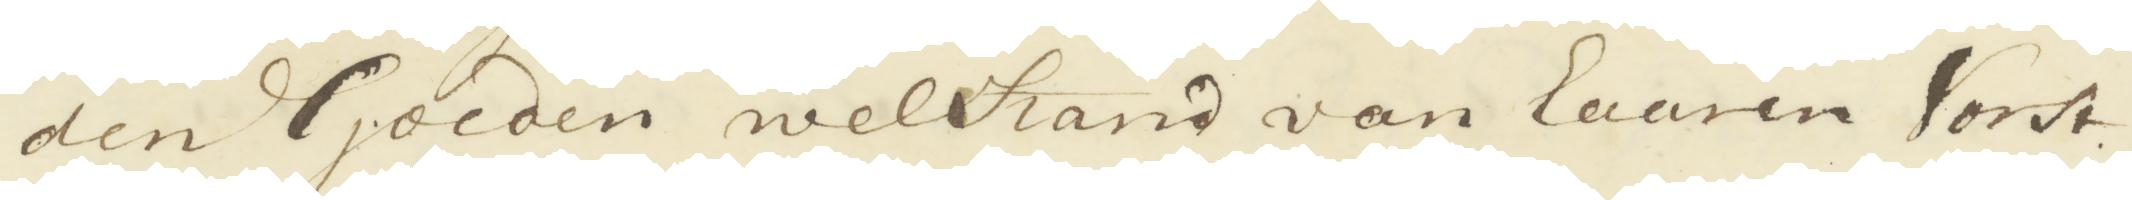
den Goeden welstand van haaren Vorst
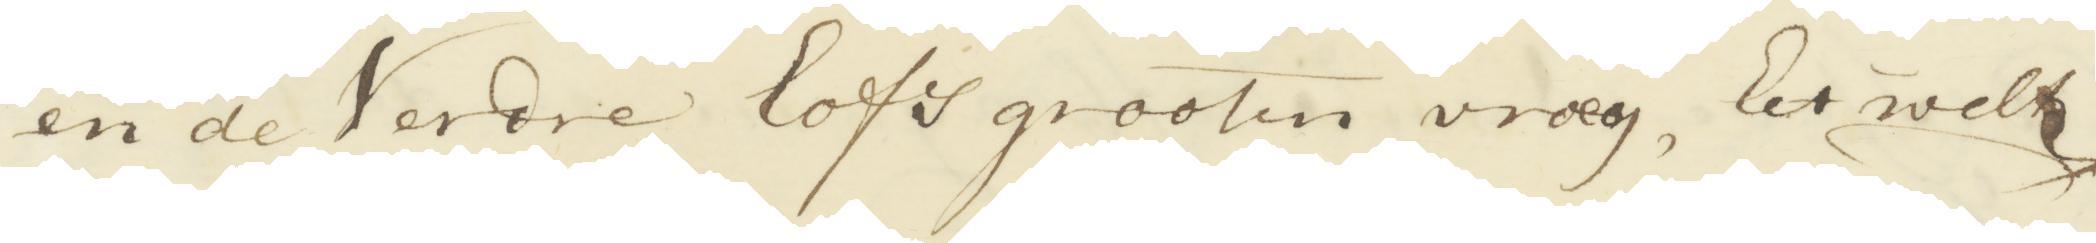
en de Verdre lofs grooten vroeg, het welk
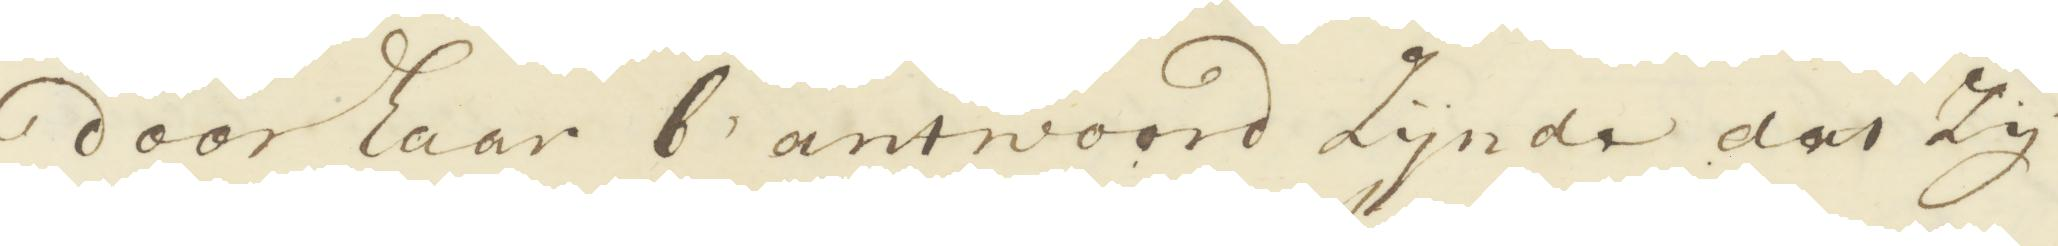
door haar b'antwoord zijnde dat zij
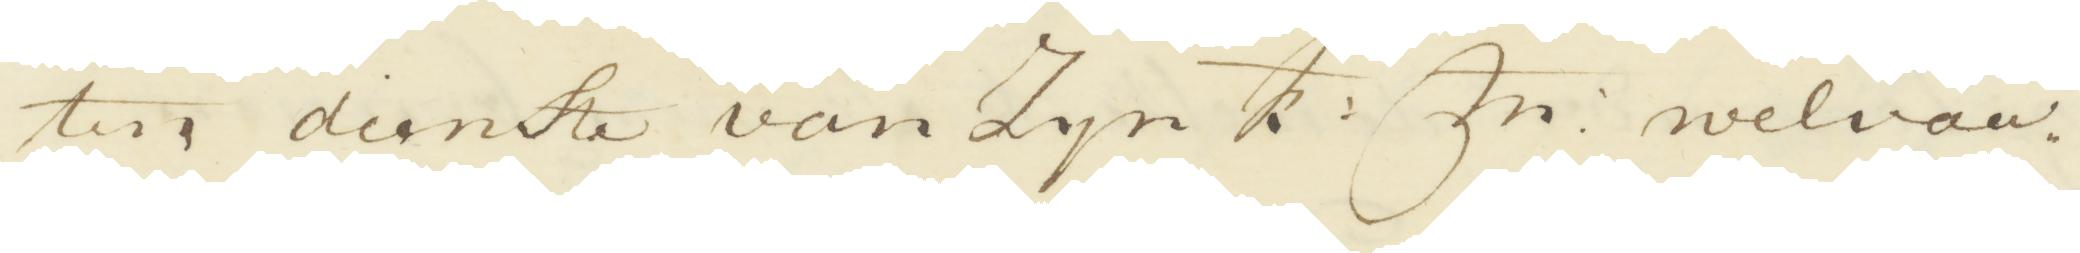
ten dienste van Zyn k: M: welvan„
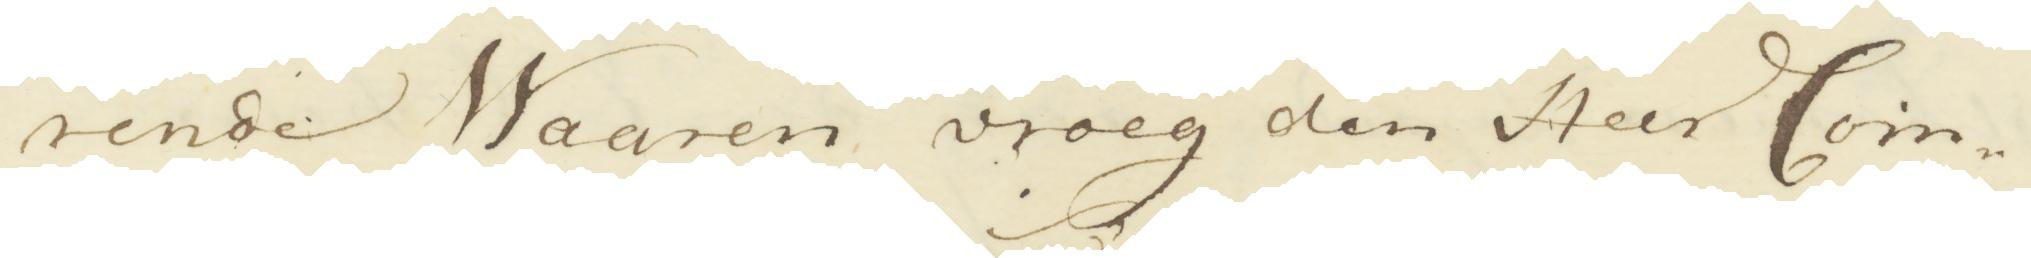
rende Waaren vroeg den Heer Com„
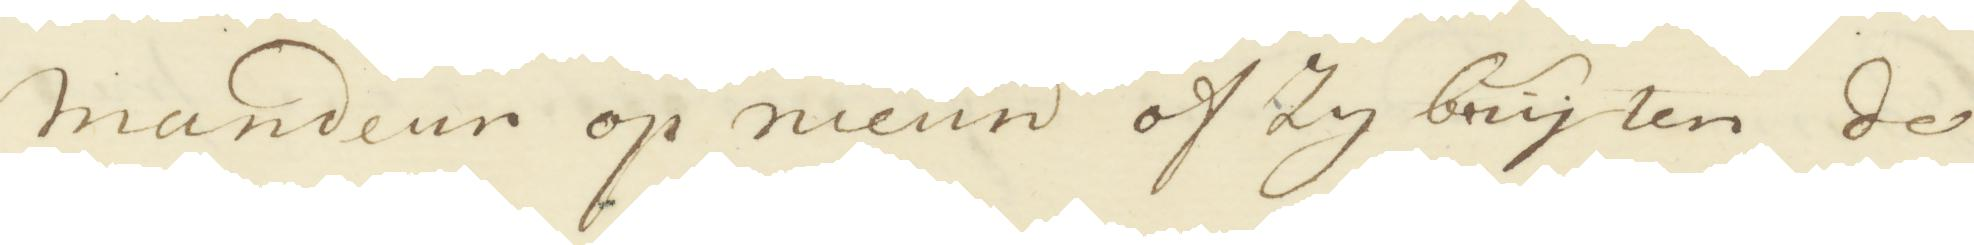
mandeur op nieuw of zy buijten de
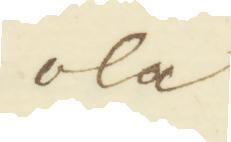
ola
